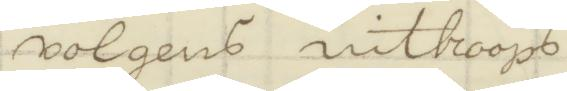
volgens uitkoops
